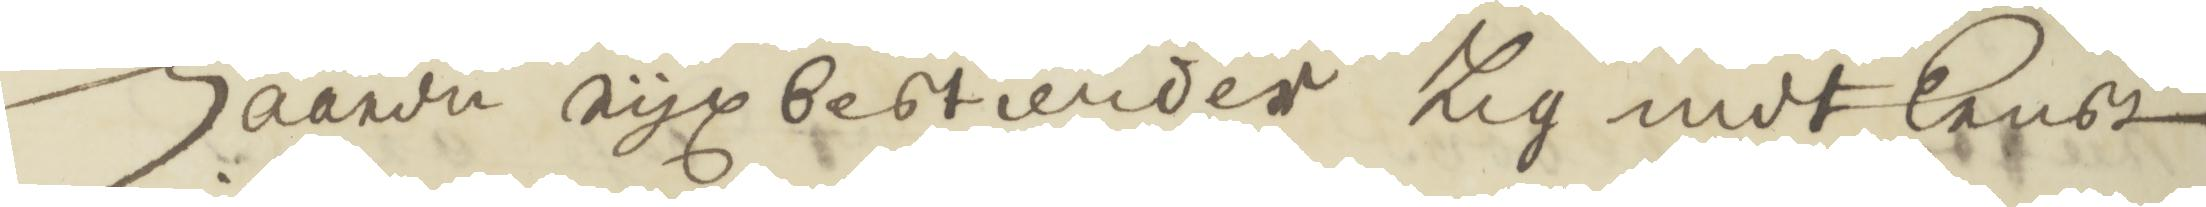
haaren rijx besterder zig met Ernst
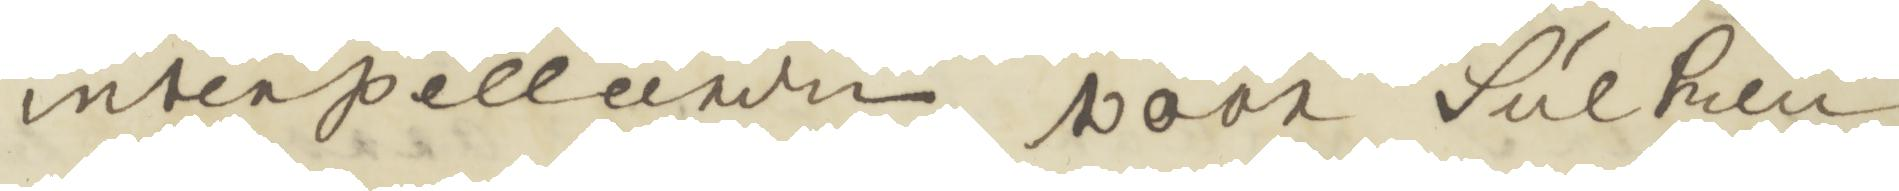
interpelleeren voor sulken
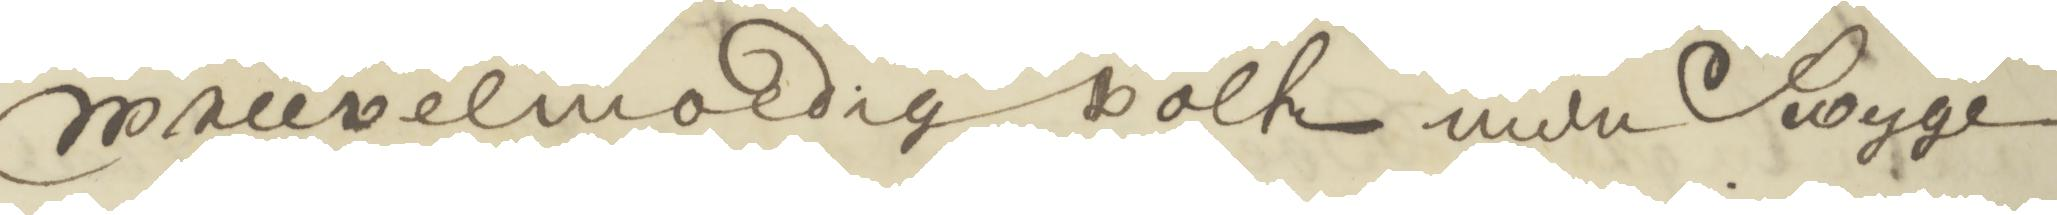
wreevelmoedig volk men swyge
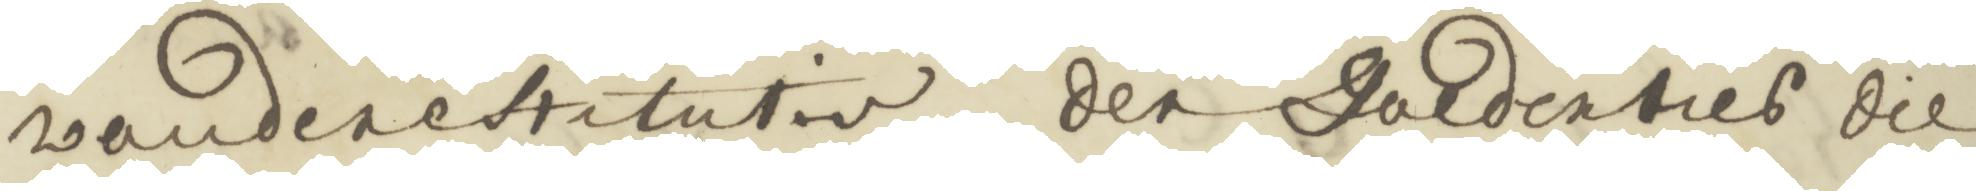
vande restitutie der golderties die
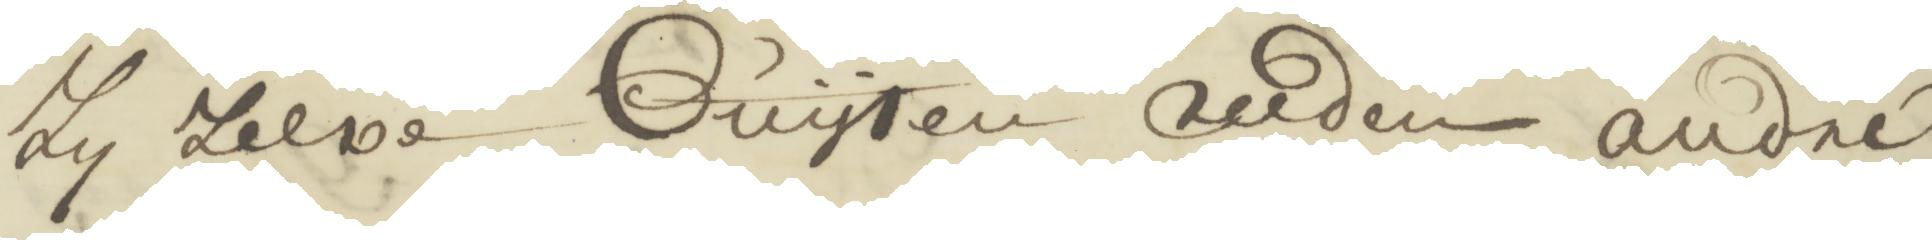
zy zelve buijten reeden andre
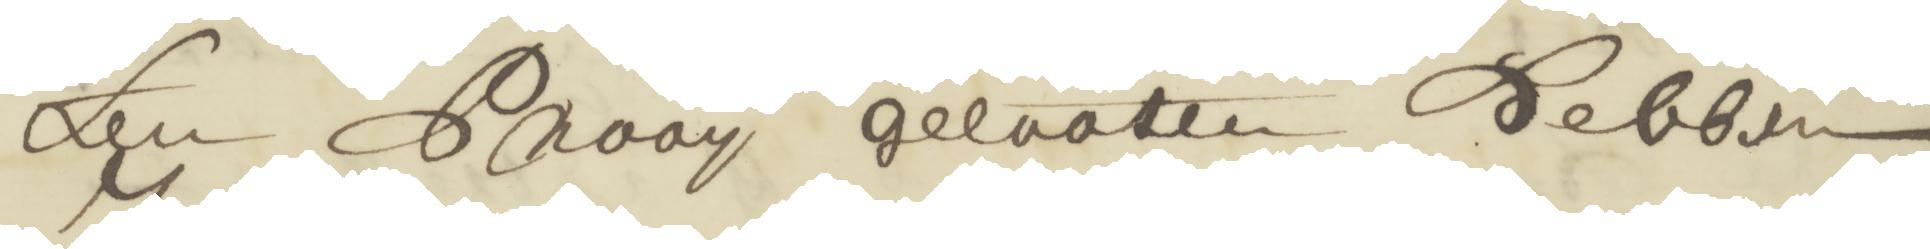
ten Prooij gelaaten hebben
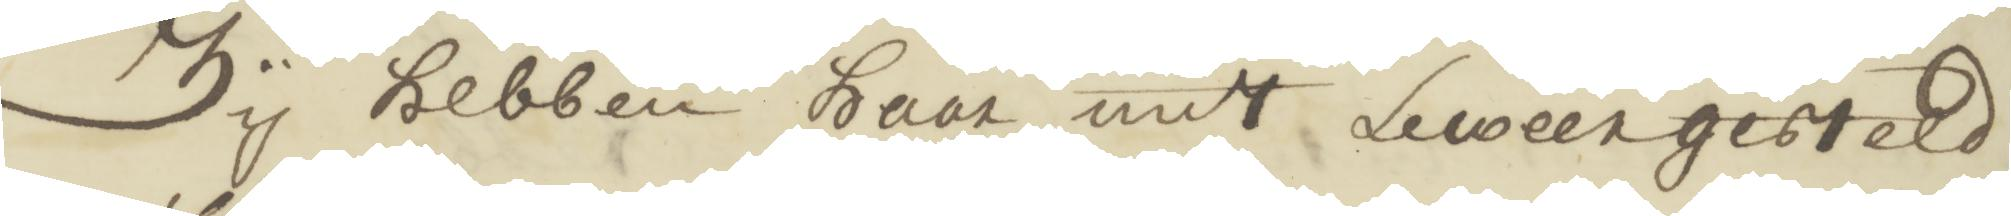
Zij hebben haar niet teweergesteld
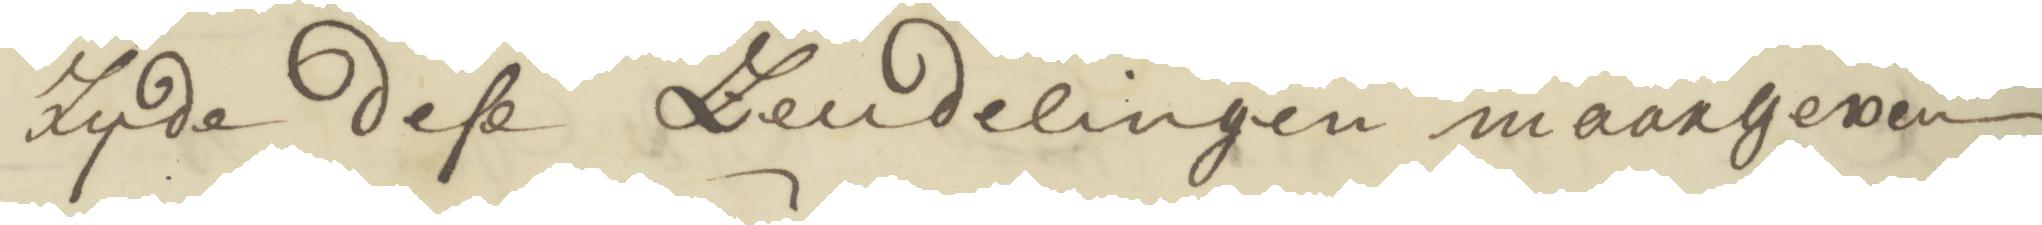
zyde dese zendelingen maargeven
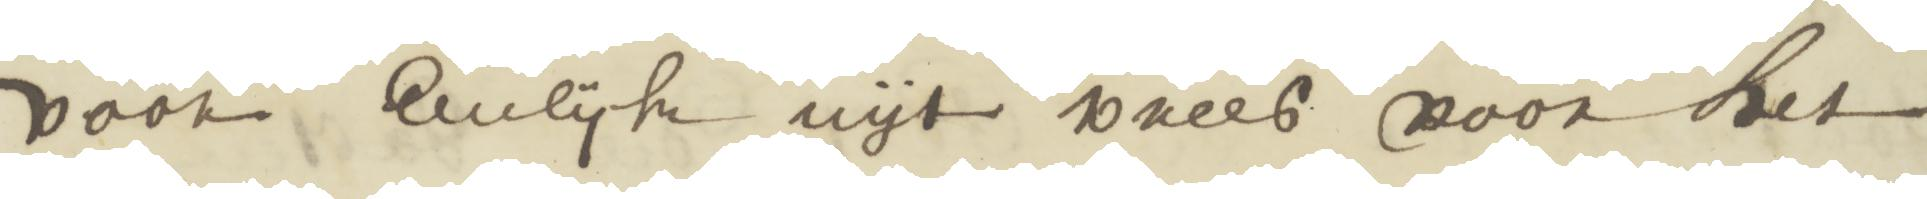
voor Eenlijk uijt vrees voor het
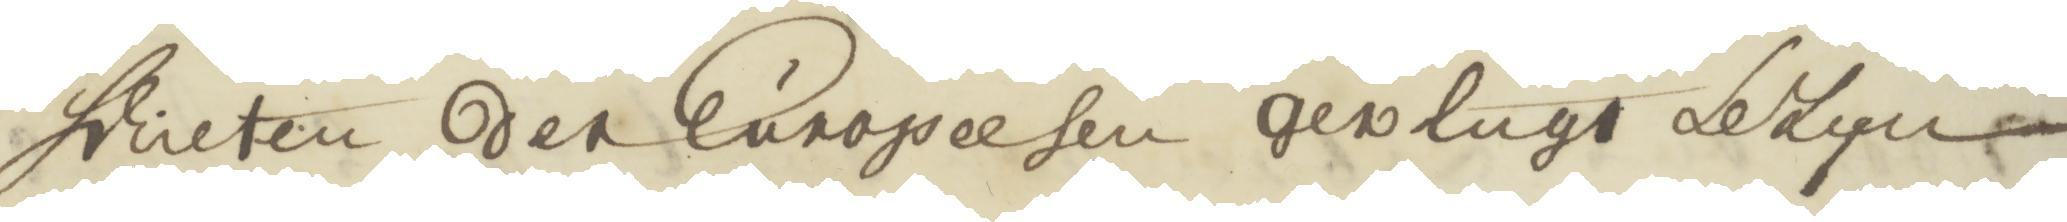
schieten der Europeesen gevlugt te zyn
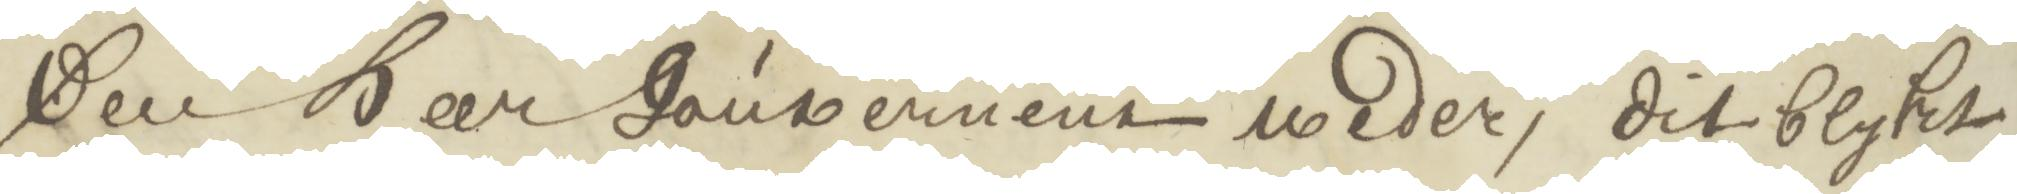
Den Heer gouverneur weder, dit blykt
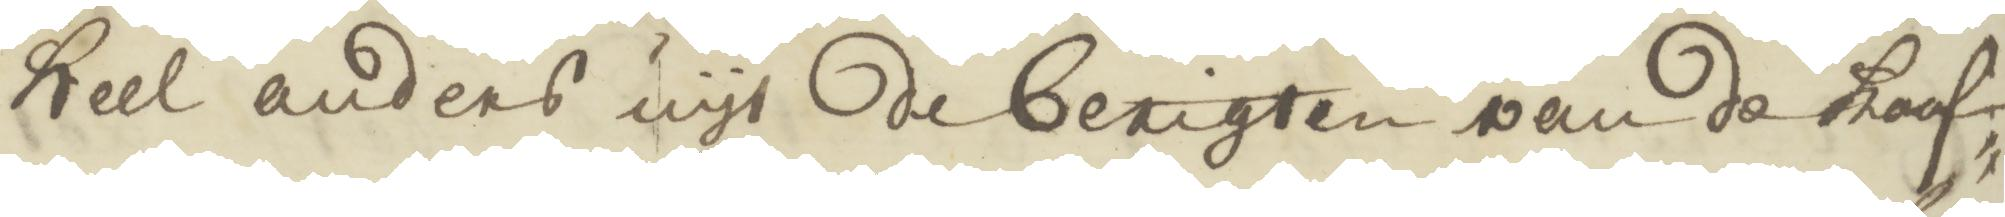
heel anders uijt de berigten van de hoof„
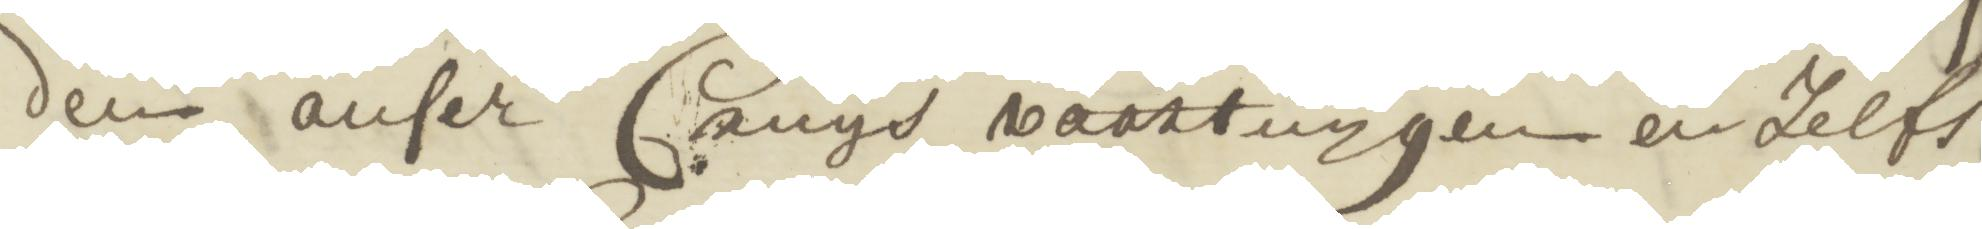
den onser Cruijs vaartuijgen en zelfs
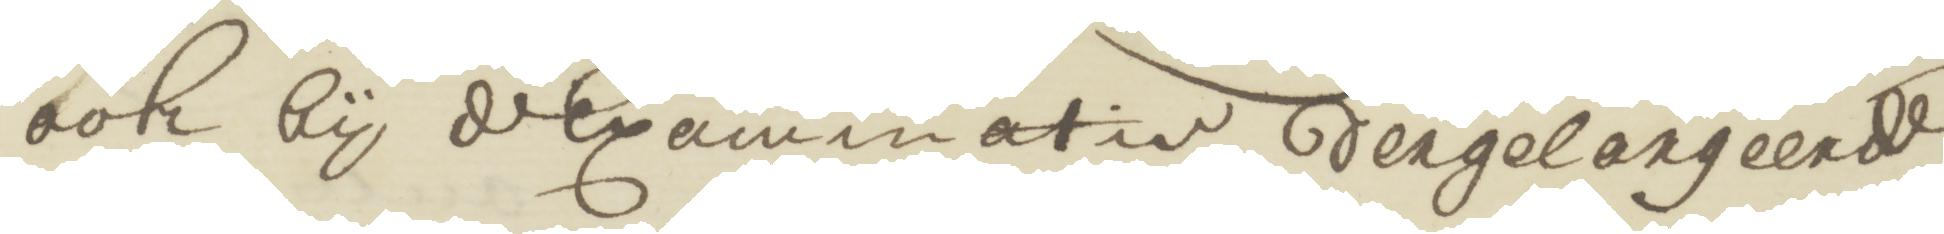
ook bij de Examinatie der gelargeerde
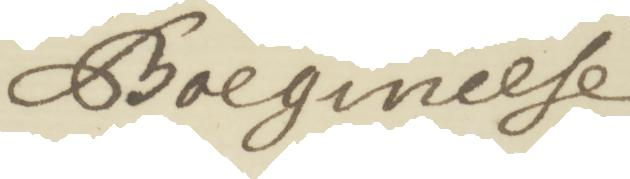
Boegineese
